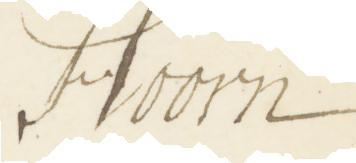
Hoorn
